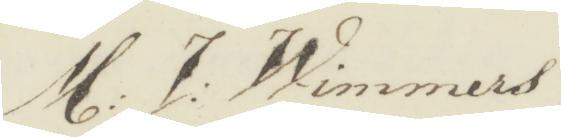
M: I: Wimmers
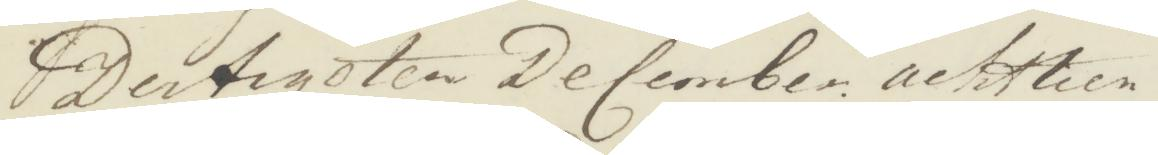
Dertigsten December achttien
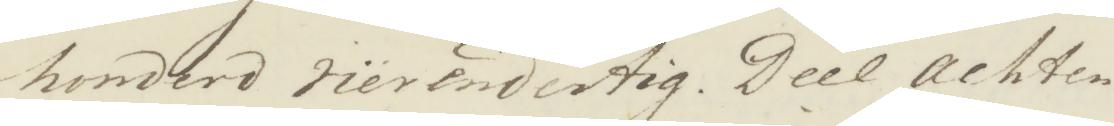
honderd vierendertig. Deel achten
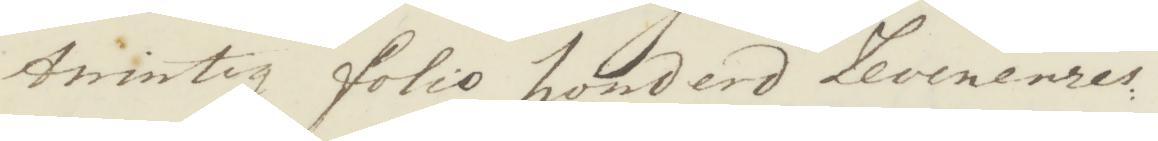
twintig folio honderd zevenenzes„
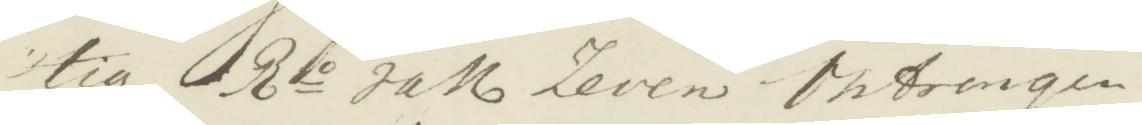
„tig R=o vak Zeven Ontvangen
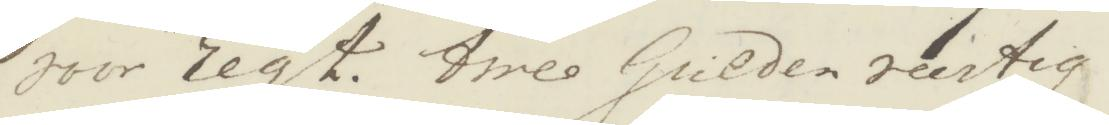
voor regt. twee Gulden veertig
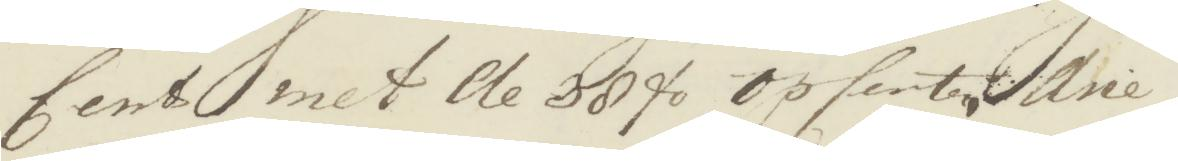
Cent met de 38% opcenten drie
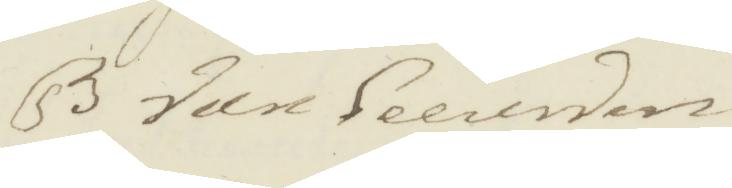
B Van Leerendan
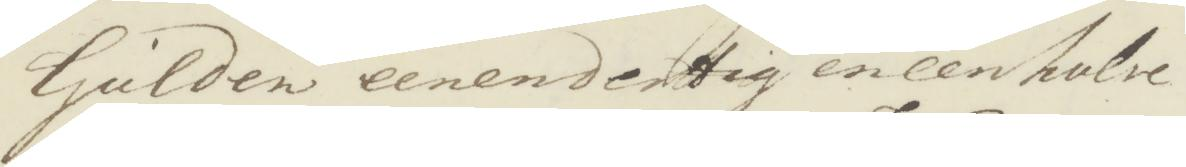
Gulden eenendertig en een halve
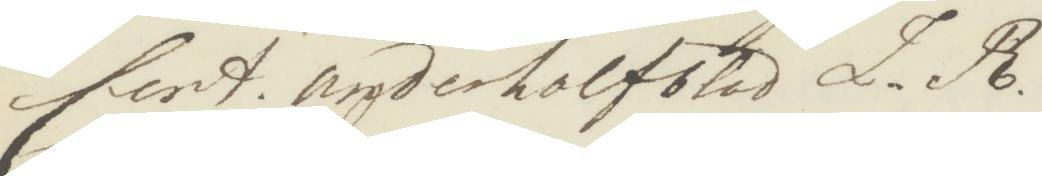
Cent. anderhalf blad L. R.
